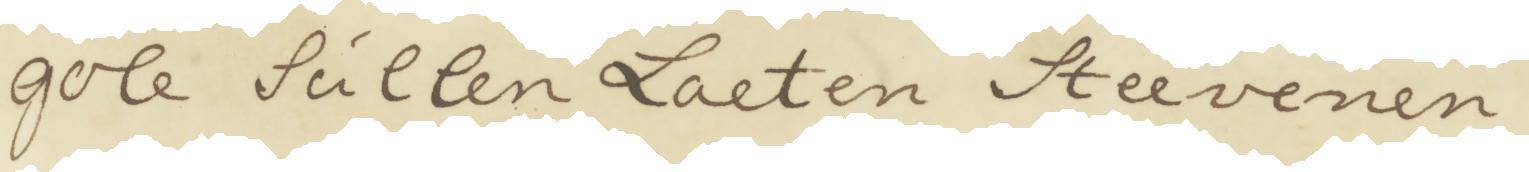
gole sullen Laeten steevenen
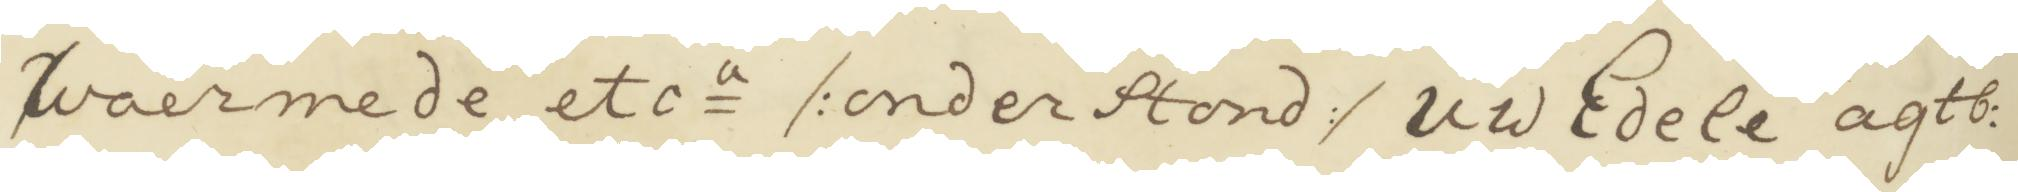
waermede etc=a /:onder stond:/ uw Edele agtb:
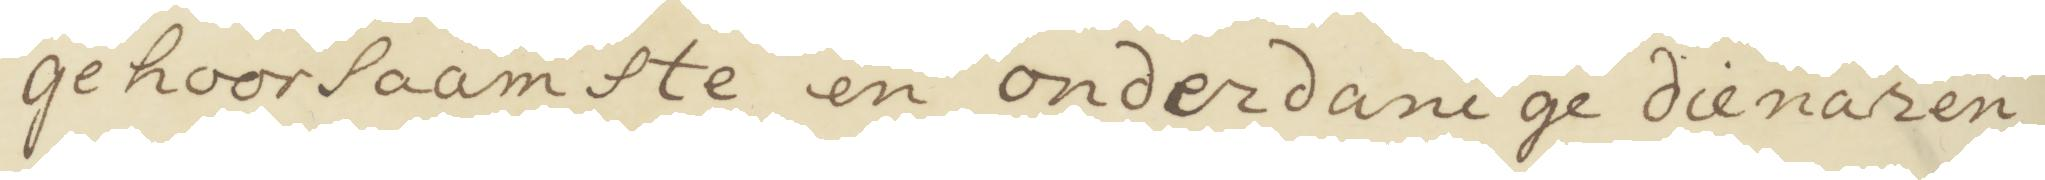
gehoorsaamste en onderdanige dienaren
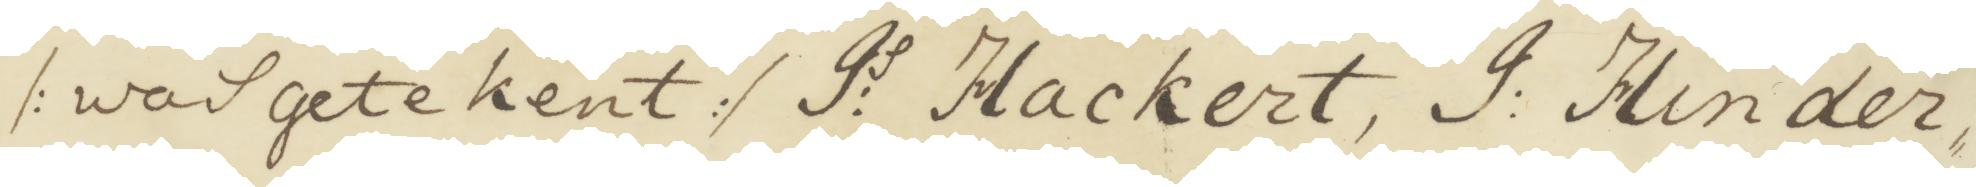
/:was getekent :/ I:s Hackert, I: Hinder„
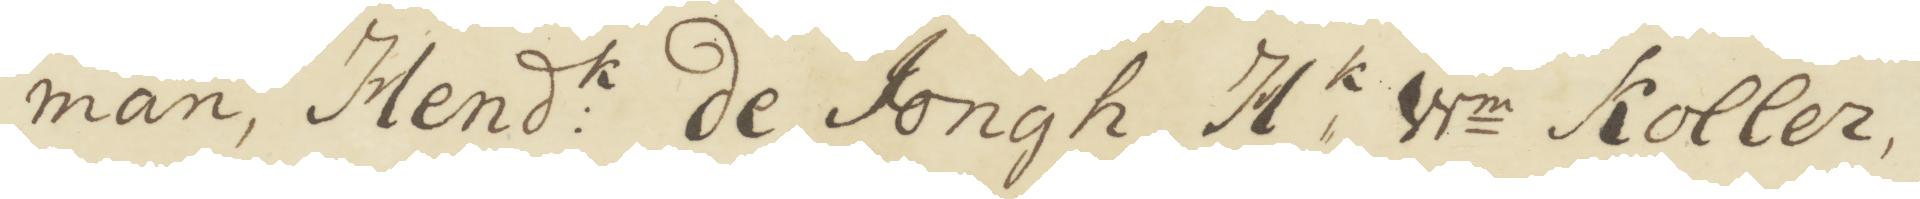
man, Hend:k de Iongh H„k w=m Koller,
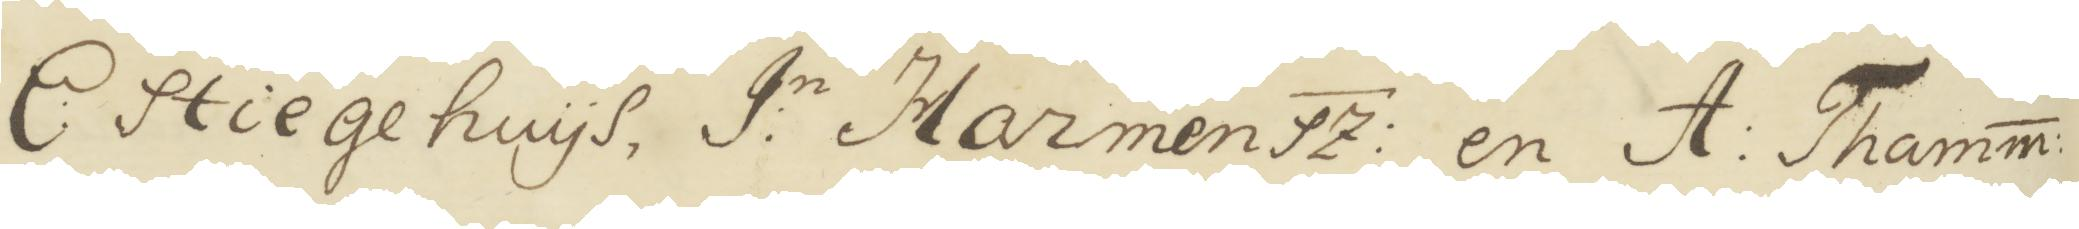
C: Stiegehuijs, I:n Harmensz: en A: Thamm:
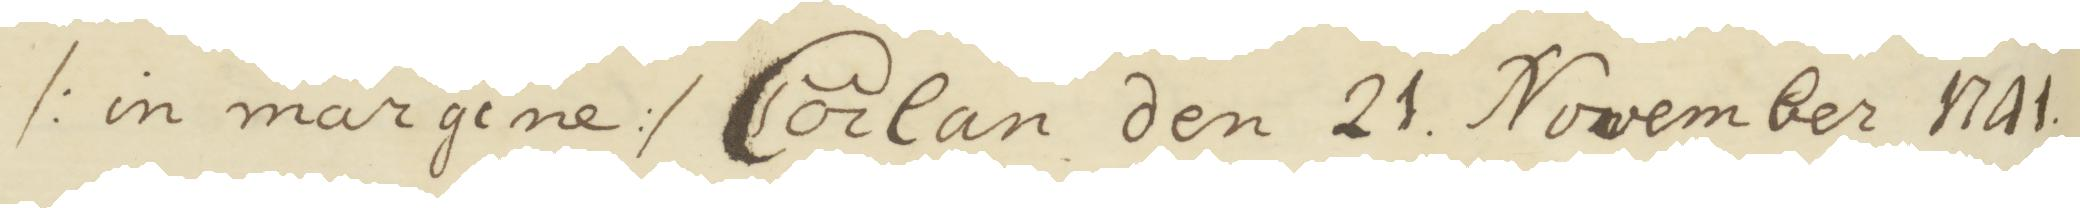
/: in margine:/ Corlan den 21. November 1741.
